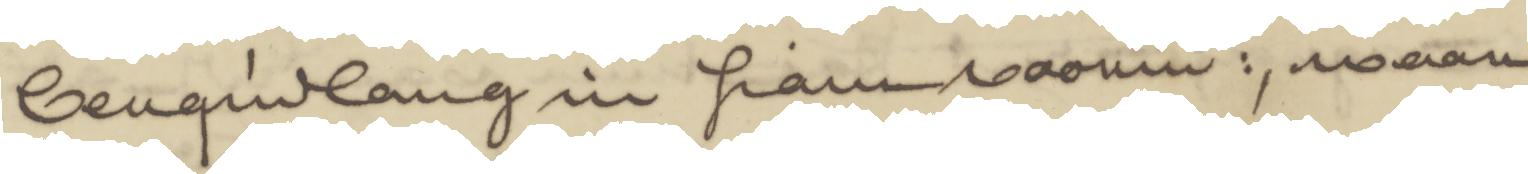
benquelang in siam voorm:, waar
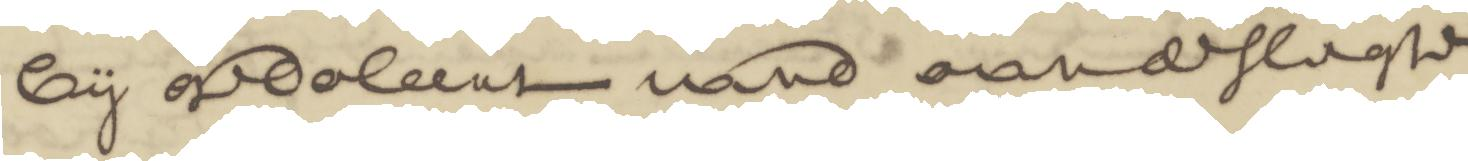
bij gedoleert wrd ovr deslegte
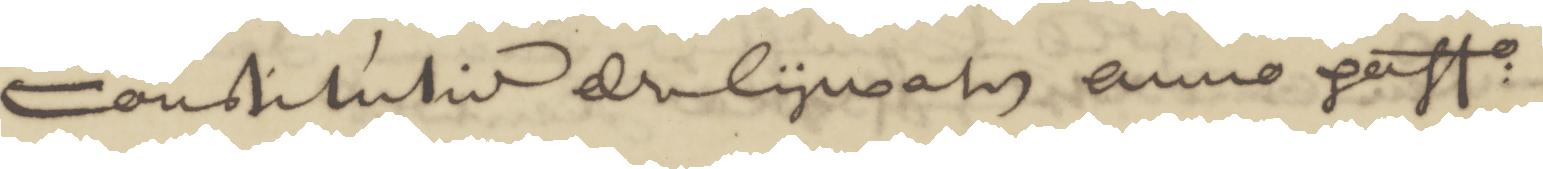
Constitutie der lijwaten anno pass:o
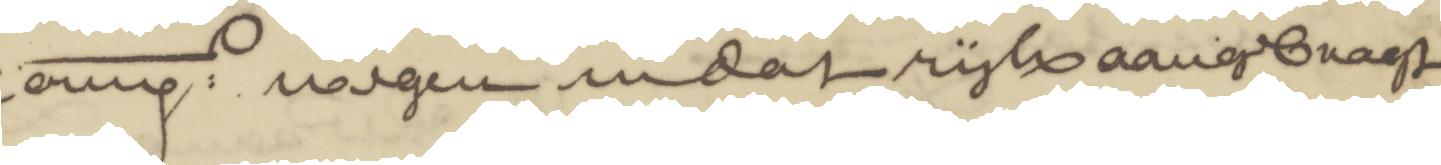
omp:s wegen in dat rijk aangebragt
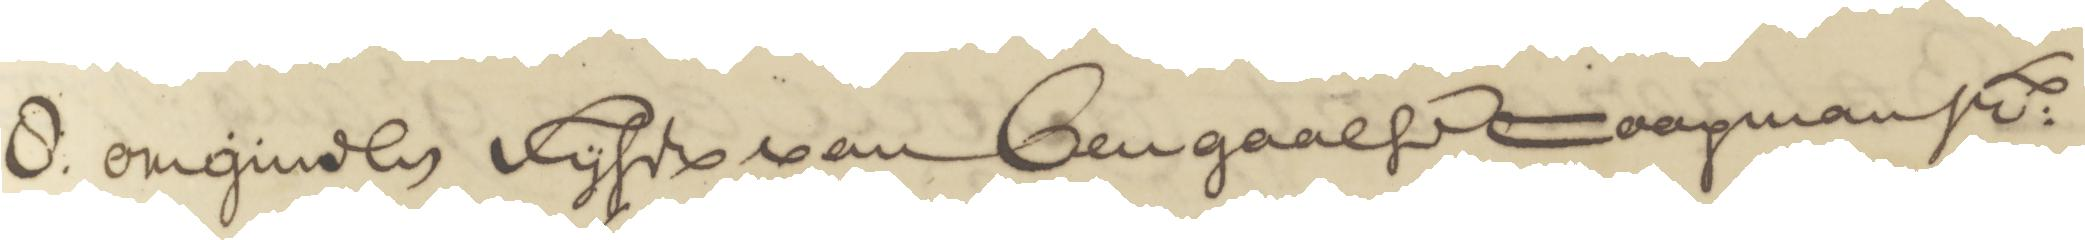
8. originelen Eijsch van Bengaalse coopmansr:
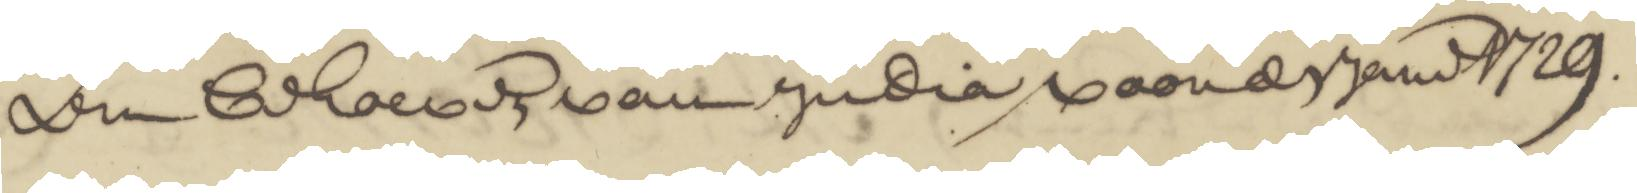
ten behoeven van jndia voor den Jare 1729.
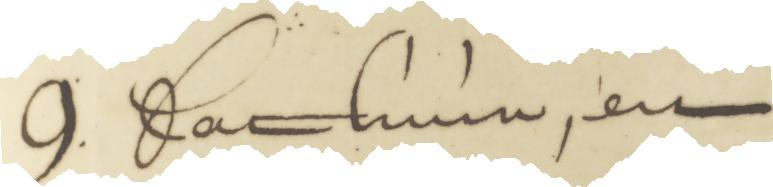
9. factuur, en
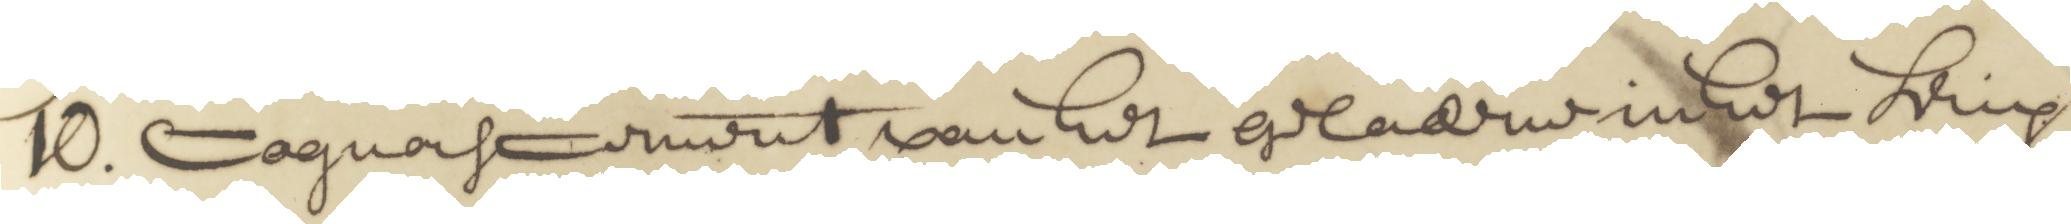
10. Coguascement van het geladene in het schip
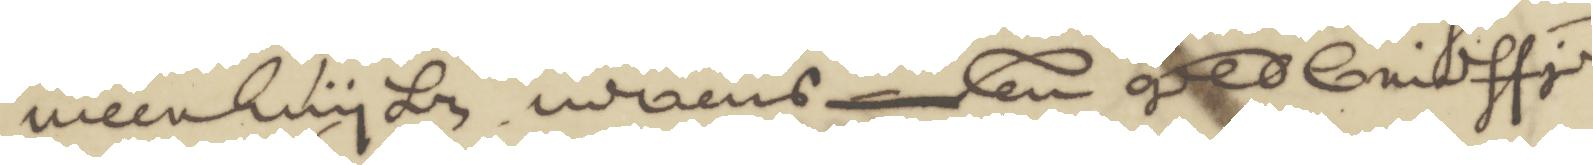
meerhuijsen nevens Een geldbrieffje
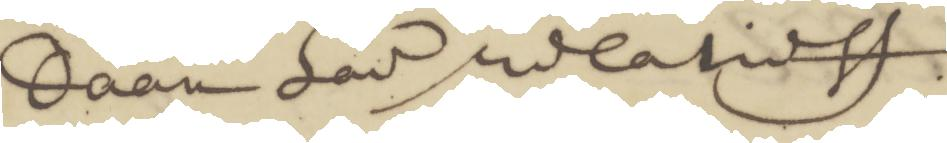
daar toe relatieff.
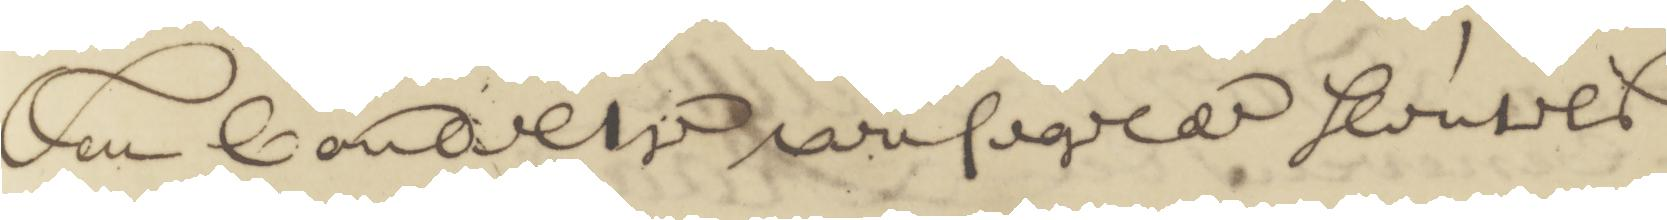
Een bondeltje versegelde sleutels
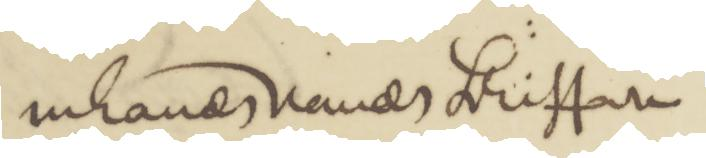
inhanden vanden schipper
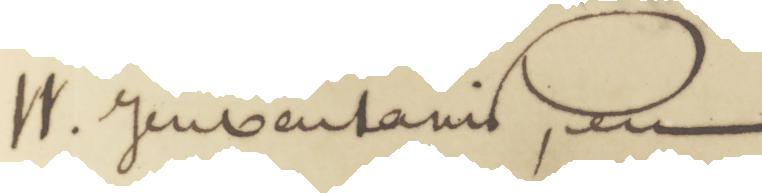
11. Jinventaris, en
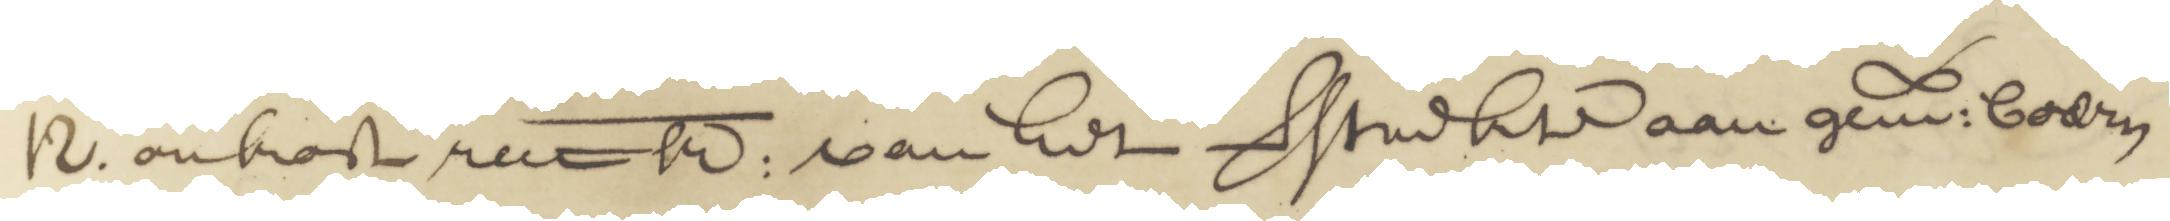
12. onkost reeck: van het verstrekte aan gem: boden
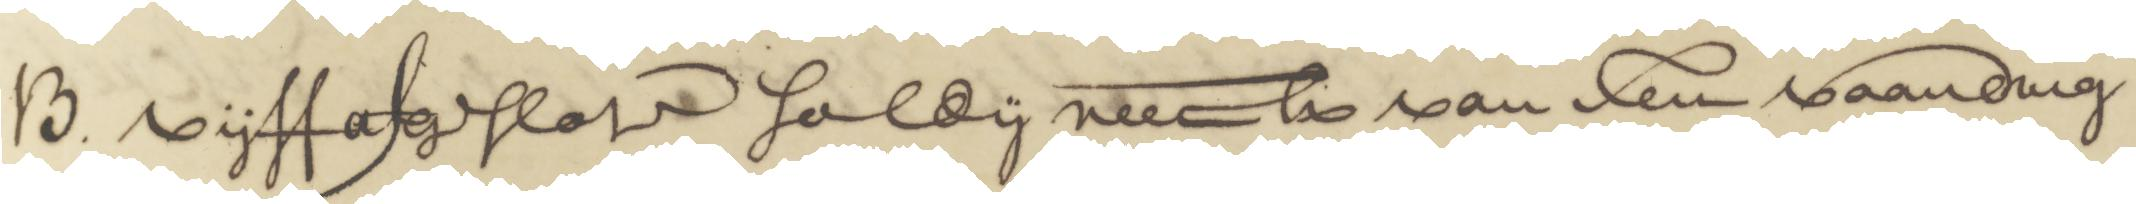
13. vijff afgeslote soldij reeck van een vaandrig
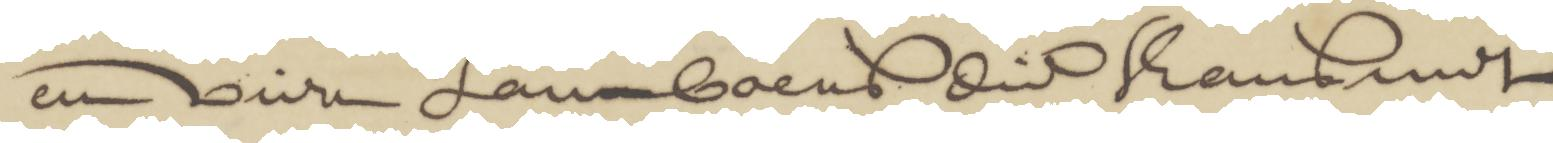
en vier tamboers die thans met
